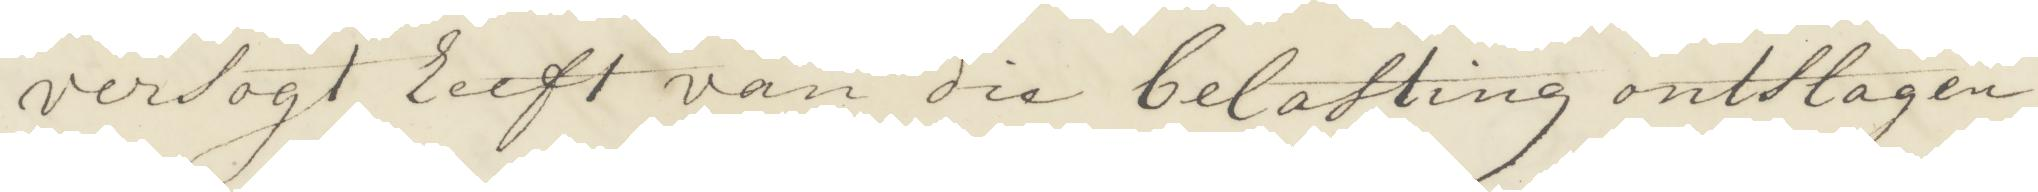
versogt heeft van die belasting ontslagen
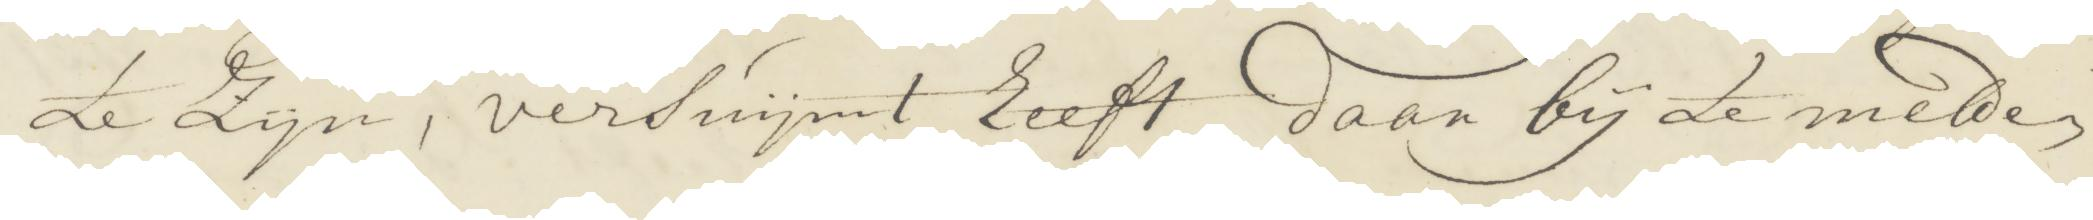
te Zijn, versuijmt heeft, daar bij te melden
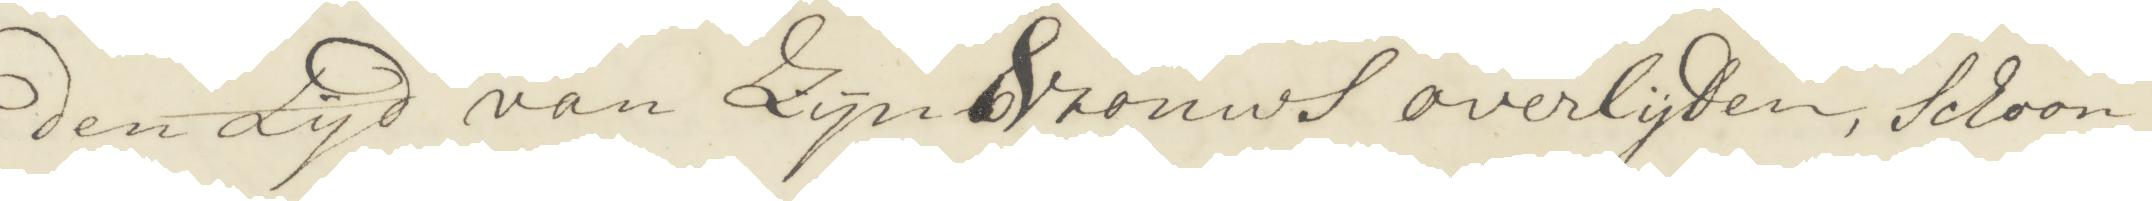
den tijd van Zijn Vrouws overlijden, Schoon
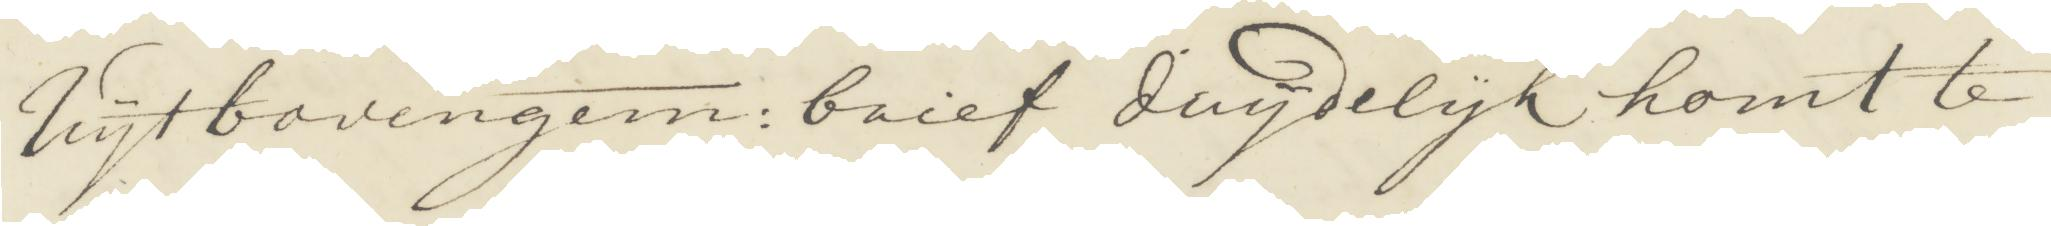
Uijt boven gem: brief duijdelijk komt te
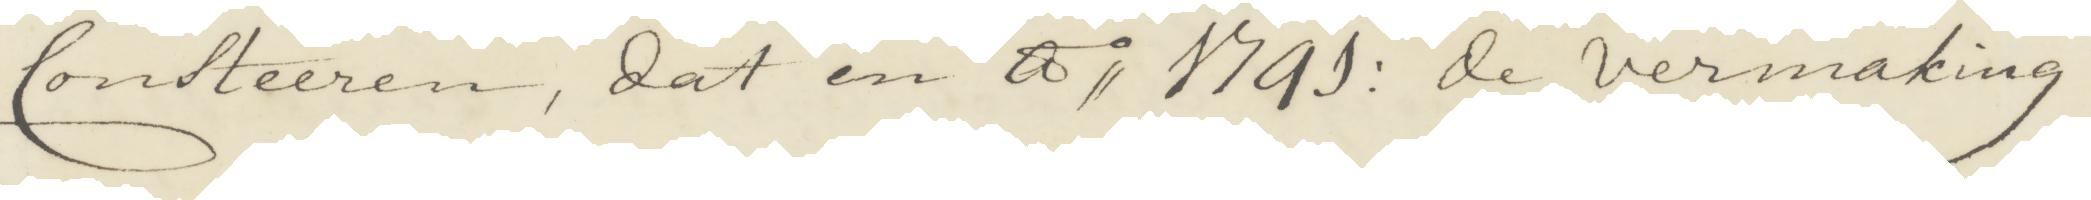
Consteeren, dat in A„o 1741: de vermaking
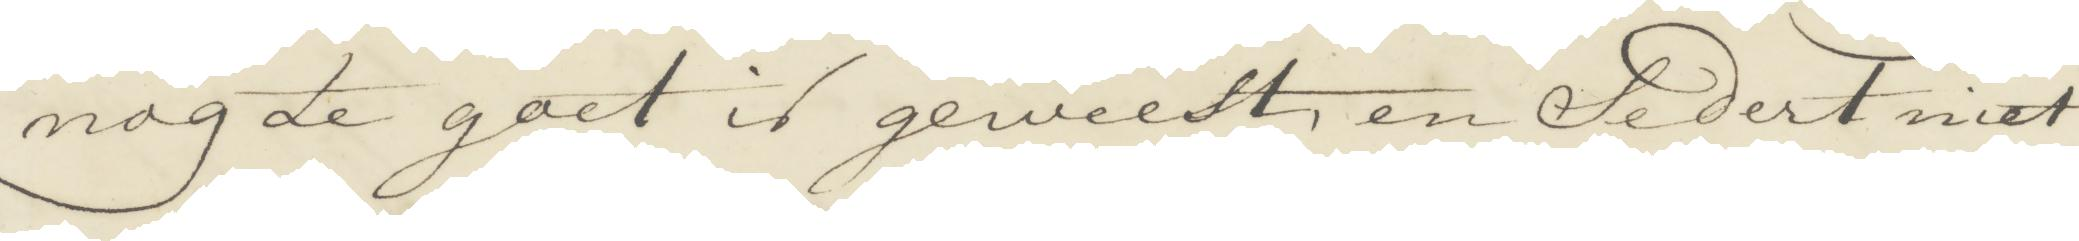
nog te goet is geweest en Sedert niet
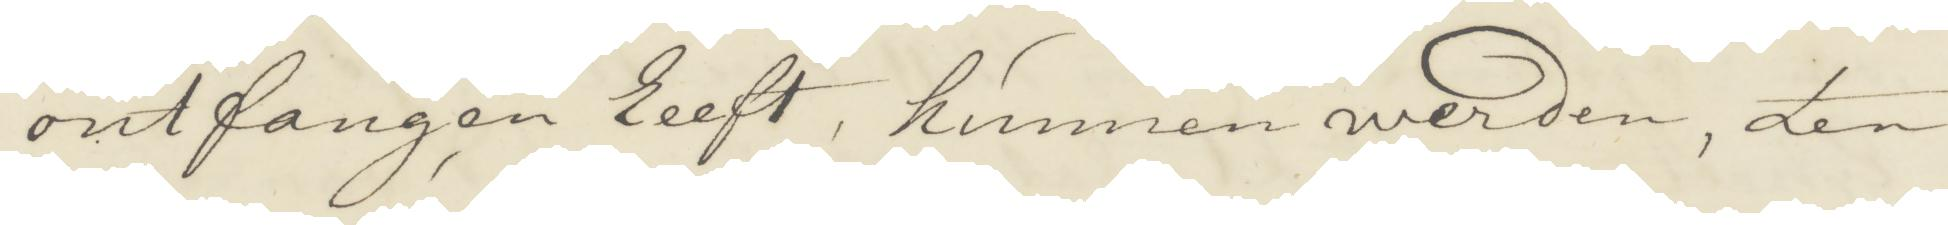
ontfangen heeft, kunnen werden, ten
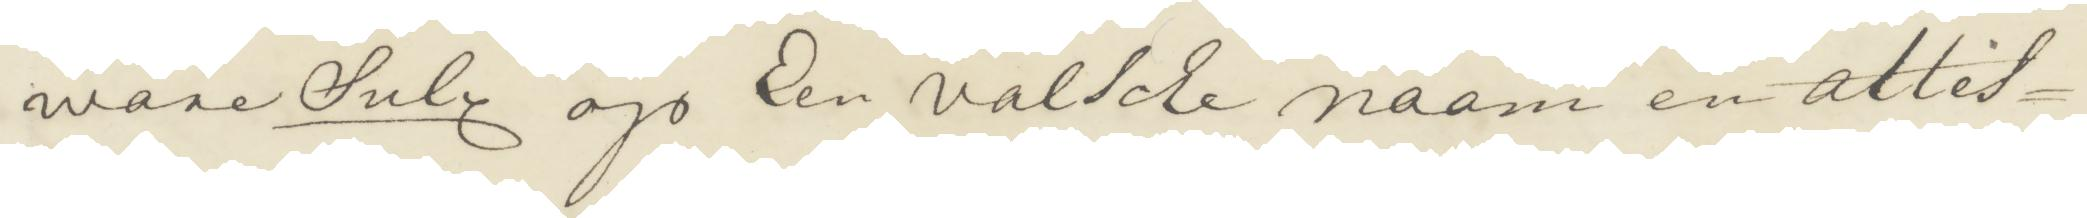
ware sulx op Een valsche naam en attes=
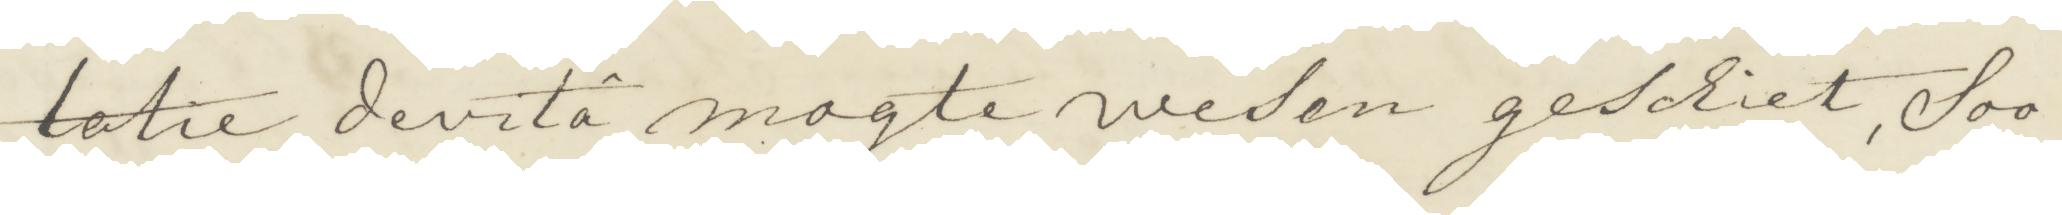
tatie devita mogte wesen geschiet, Soo
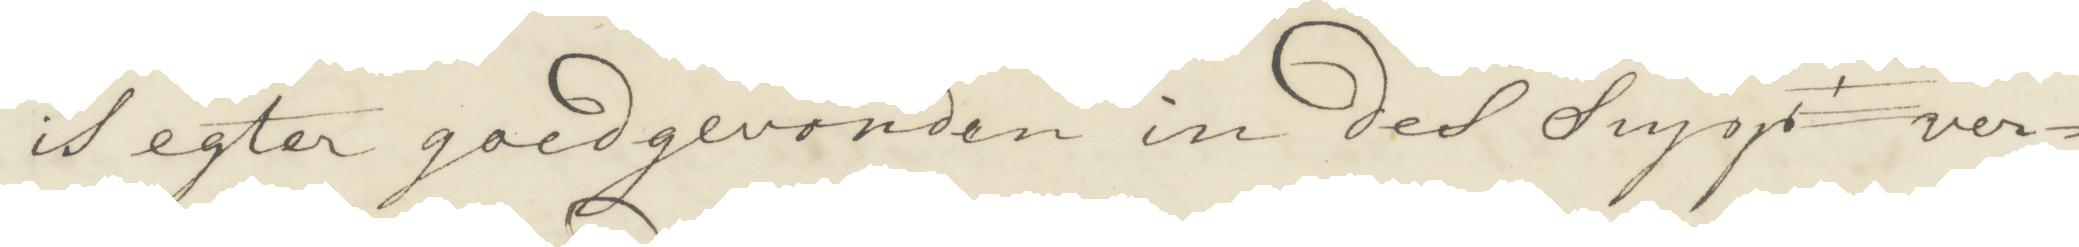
is egter goed gevonden in des supp=t ver=
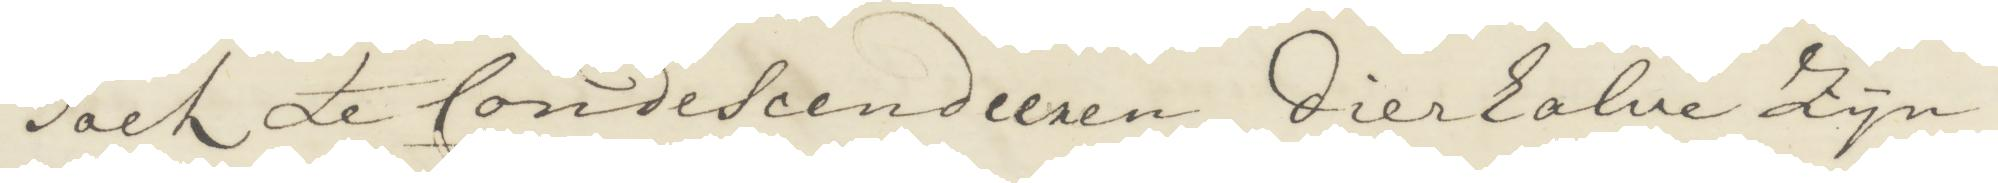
soek te Condescendeeren, dierhalve Zijn
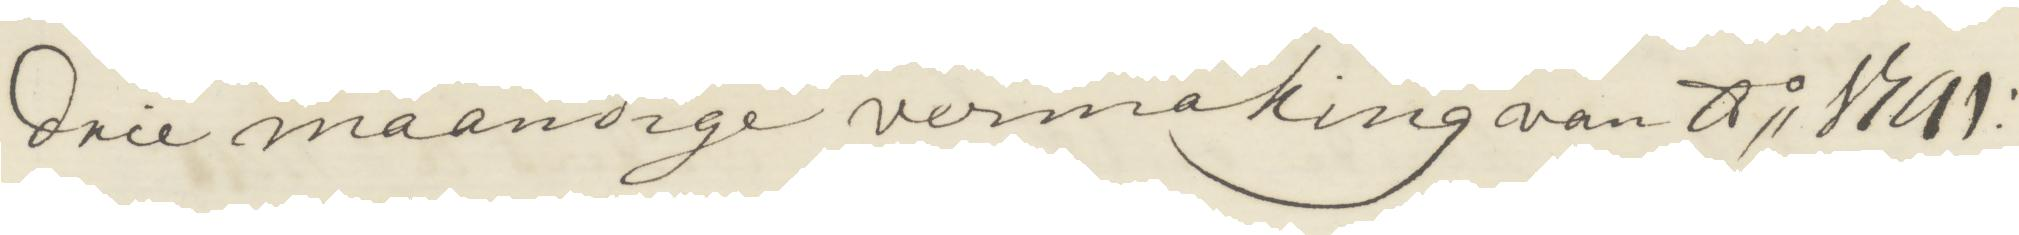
drie maandige vermaking van a„o 1741:
